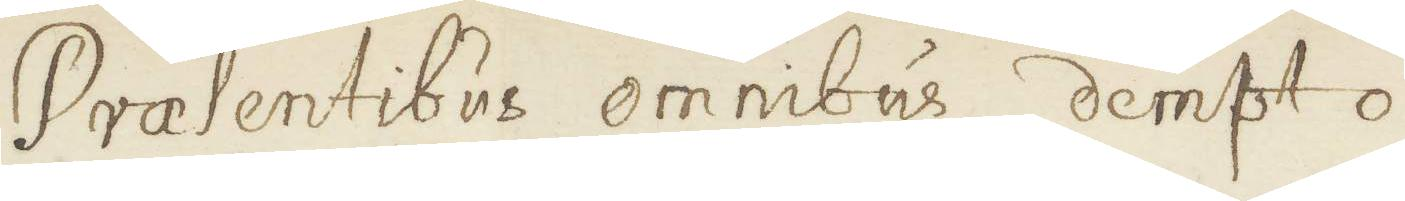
Praesentibus omnibus dempto d' H=r
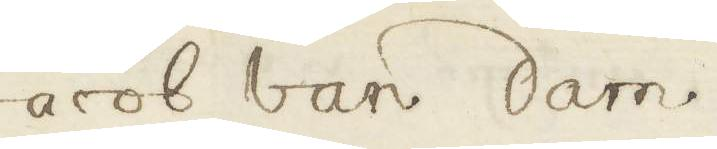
Jacob van dam.
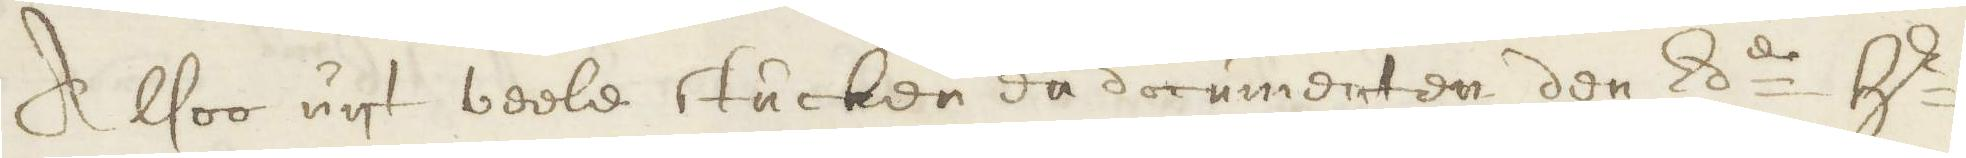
Alsoo uijt veele stucken en documenten den Ed=e h=r
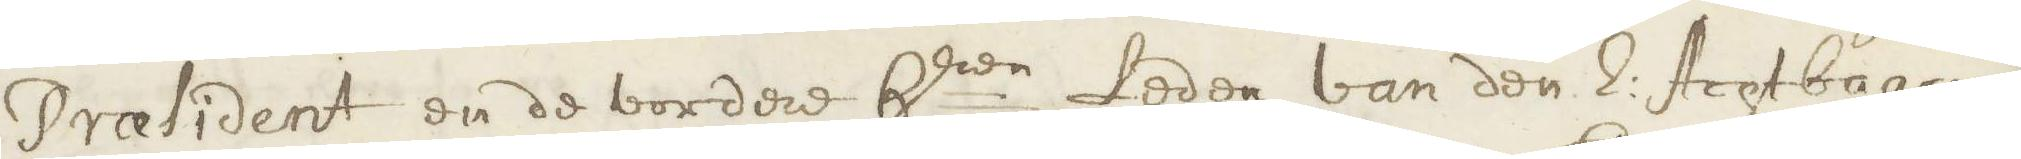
Praesident en de vordere h=ren Leden van den E: Achtbaaren
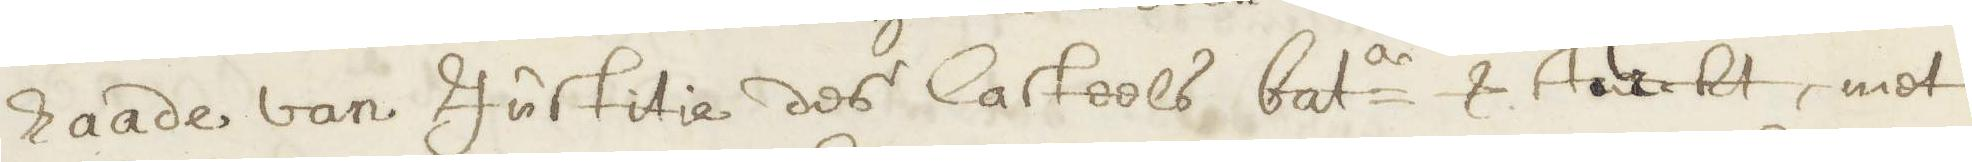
Raade van Justitie des Casteels bat=a versterckt, met
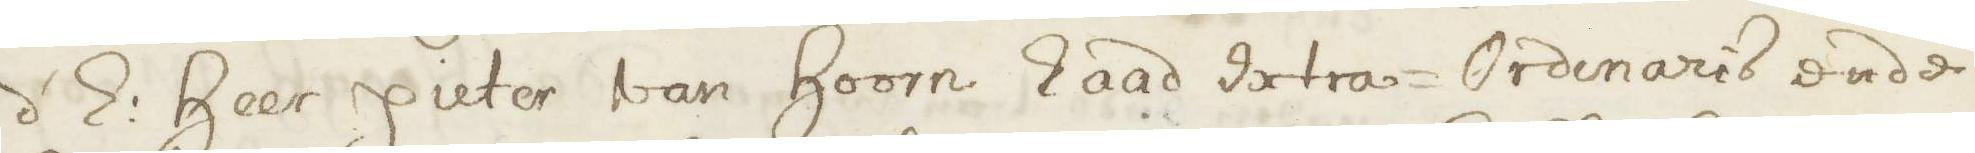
d’ E: heer pieter van hoorn raad extra- Ordenaris ende
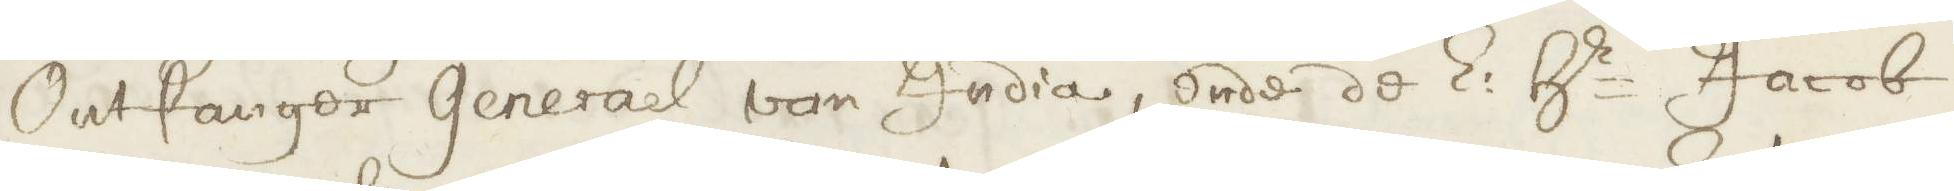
Ontfanger generael van Jndia, ende de E: H=r Jacob
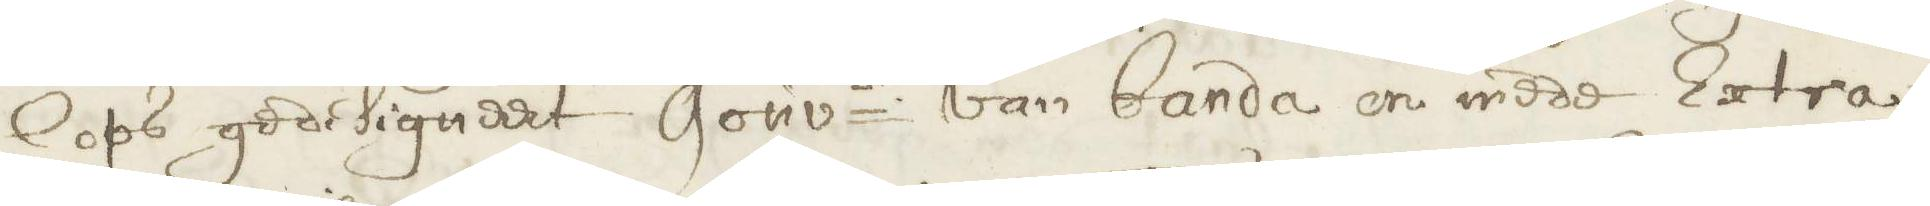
Cops gedesigneert Gouv=r van banda en mede Extra=
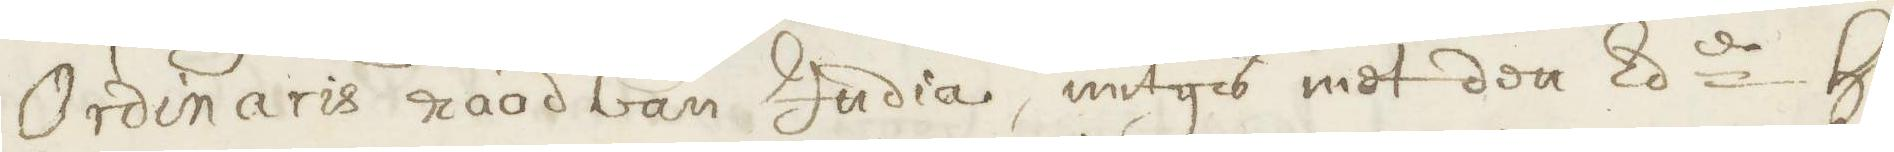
Ordinaris raad van Jndia, mitgrs met den Ed=e h=r
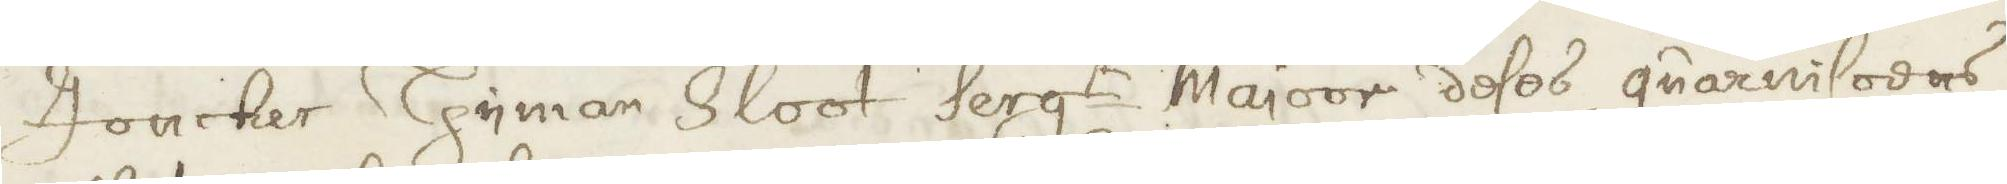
Joncker Thijman Sloot serg=t Majoor deses guarnisoens
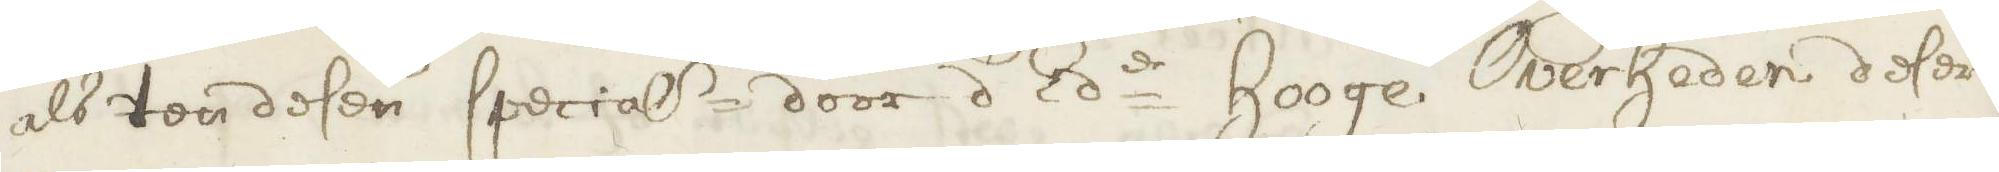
als ten desen specialijk door d' Ed=e hooge Overheden deser
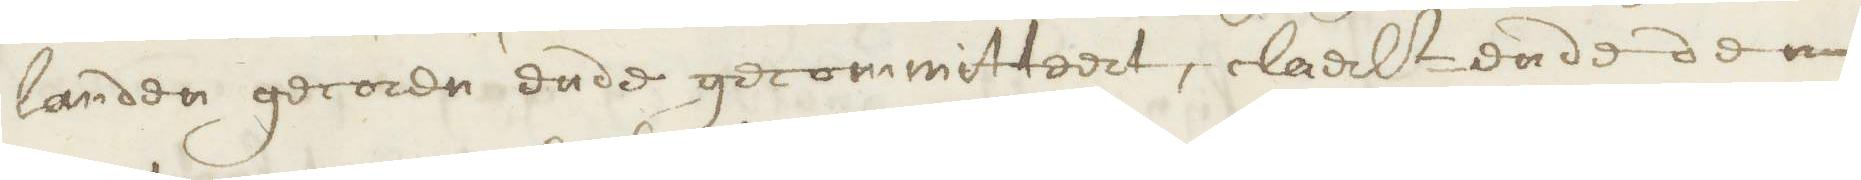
landen gecoren ende gecommitteert, claerlijk ende den
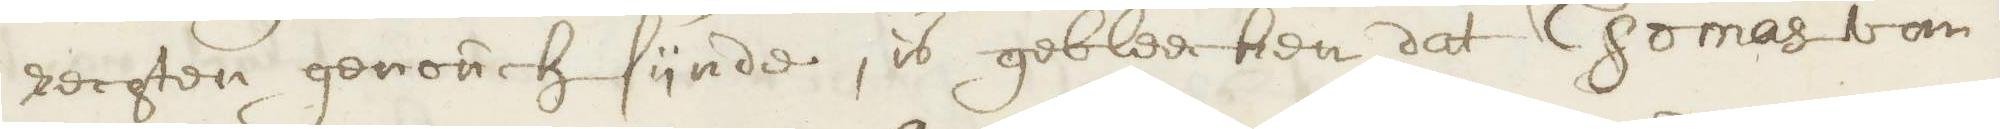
rechten genouch sijnde, is gebleecken dat Thomas van
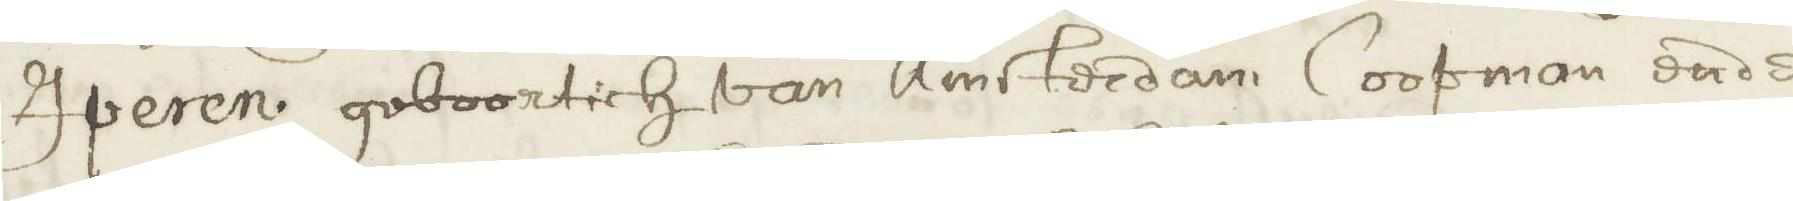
Jperen geboortich van Amsterdam Coopman ende
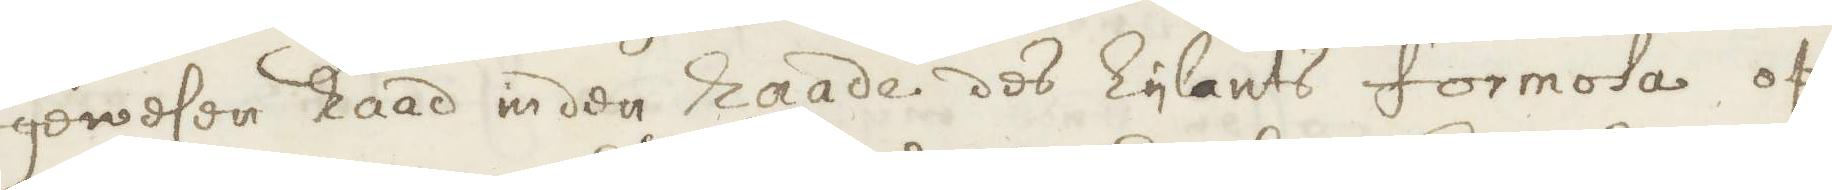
gewesen Raad in den Raade des Eijlants formosa op
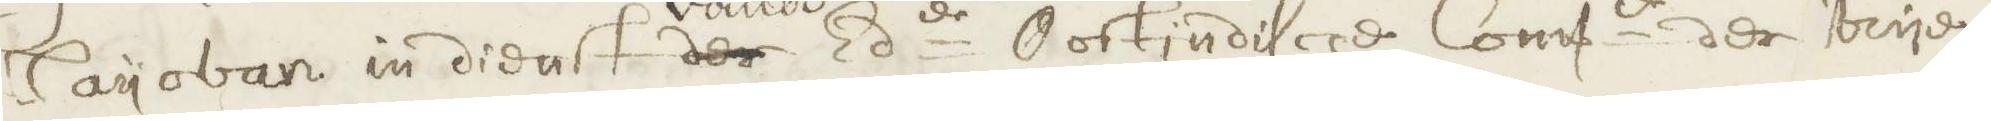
Taijovan in dienst der Ed=e Oostindische Comp=e der vrije
